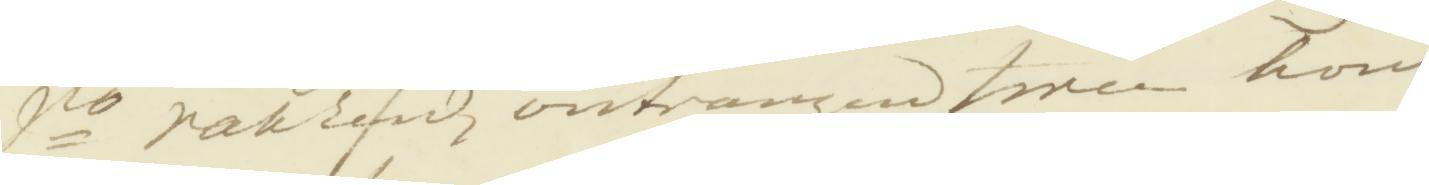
V=o vak Een ontvangen twee hon
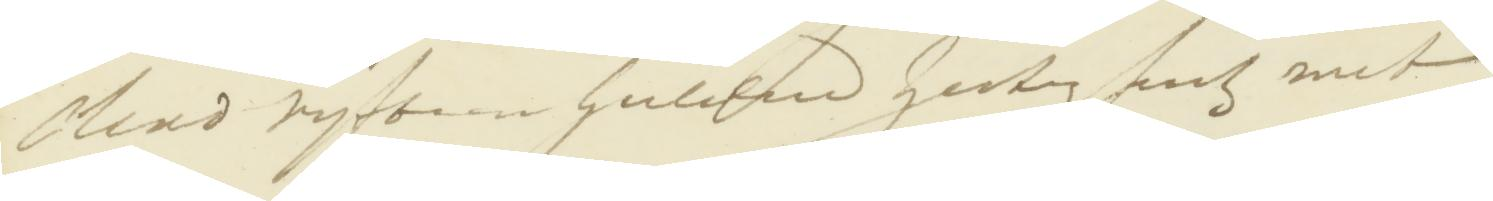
derd vyftien Gulden Zestig Cent met
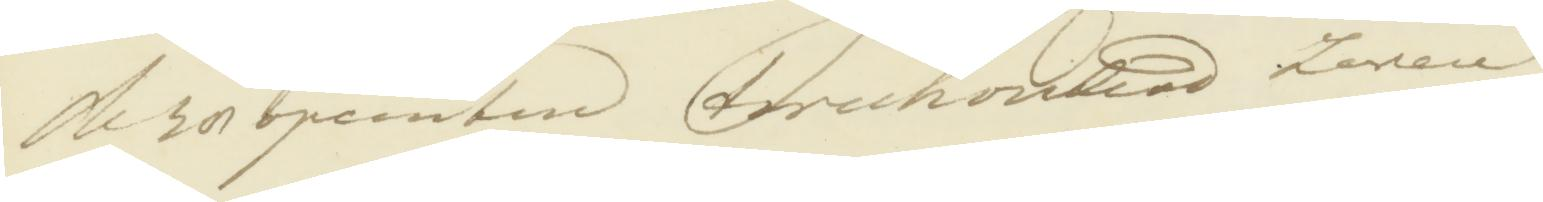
de 38 opcenten tweehonderd zeven
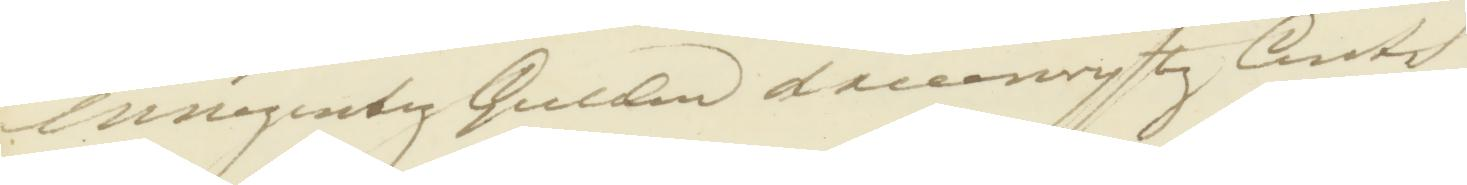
ennegintig Gulden drieenvijftig Cents
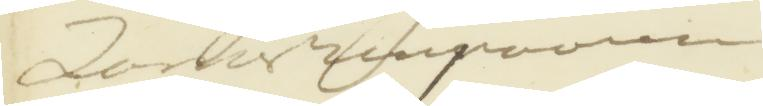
Zonder renvooien
